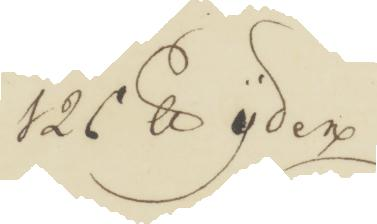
125 lb ijder
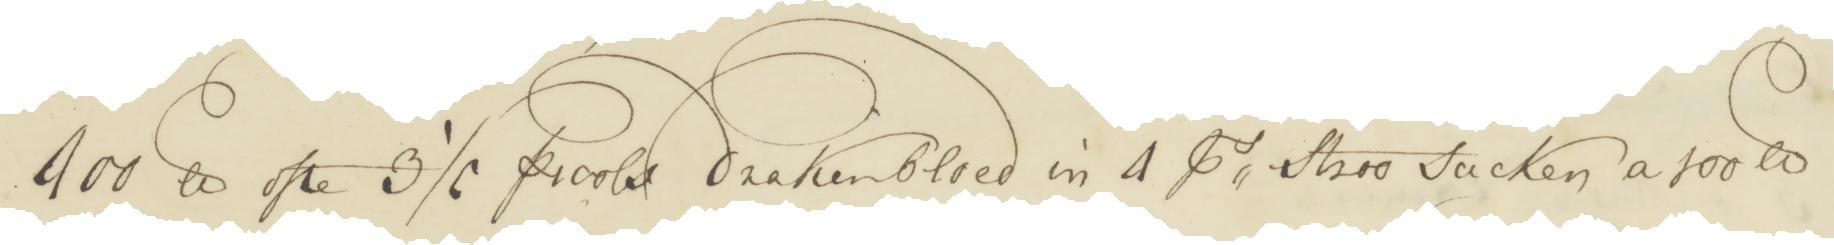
400 lb ofte 3 1/5 picols drakenbloed in 4 p„s stroo sacken a 100 lb
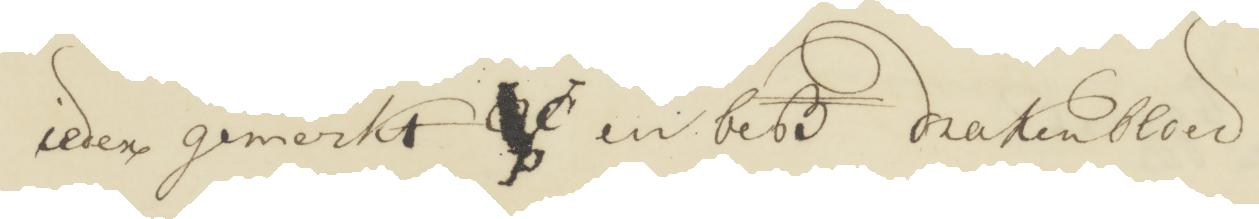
ieder gemerkt en best drakenbloed
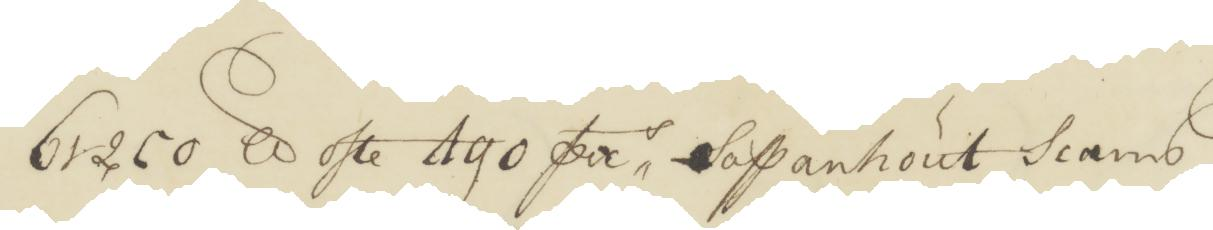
61250 lb ofte 490 pic„s sappanhout siams
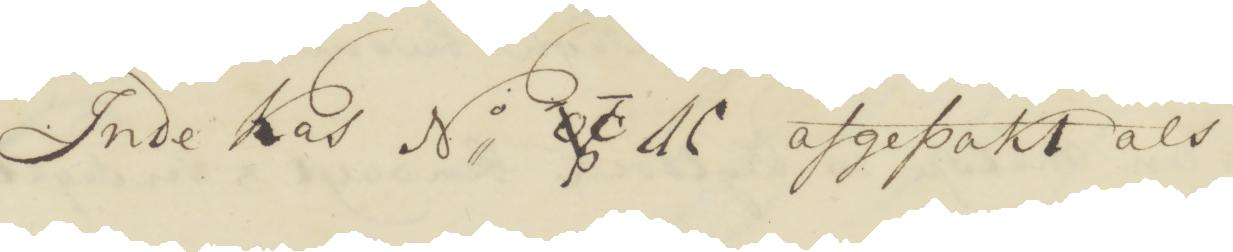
Inde Kas N„o 45 afgepakt als
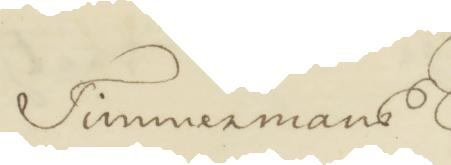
Timmermans
